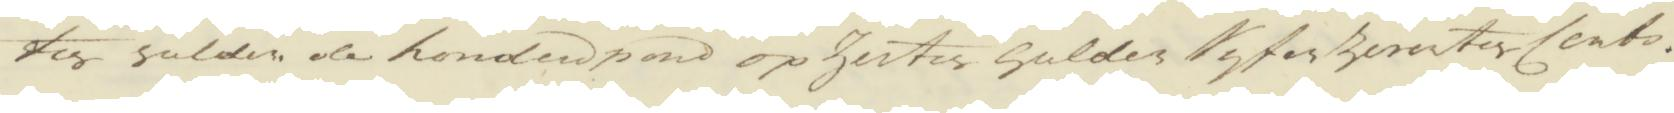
tig gulden de honderd pond op Zestig Gulden Vyf en Zeventig Cents
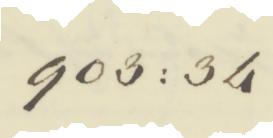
903: 34
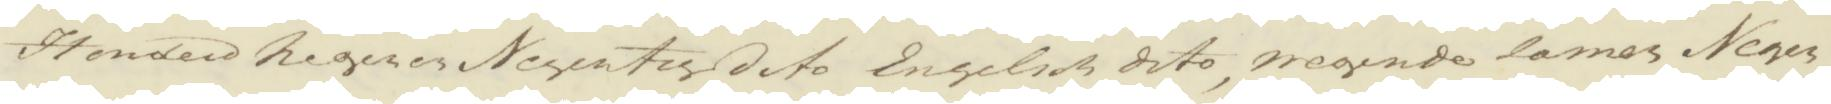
Honderd negen en Negentig dito Engelsch dito, wegende zamen Negen
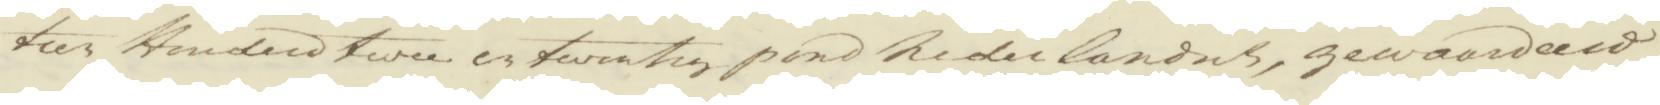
tien Honderd twee en twintig pond nederlandsch, gewaardeerd
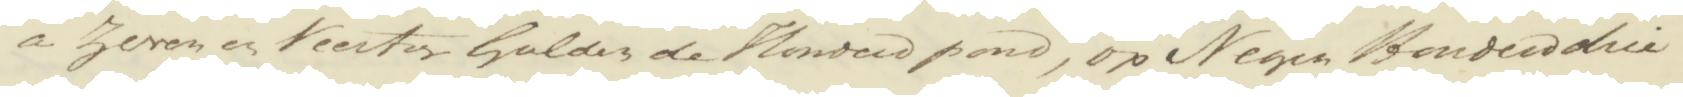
a Zeven en Veertig Gulden de Honderd pond, op Negen Honderd drie
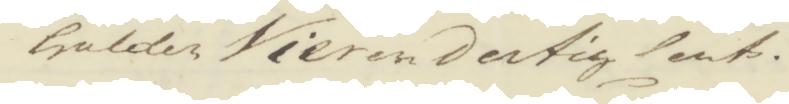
Gulden Vieren dertig Cents
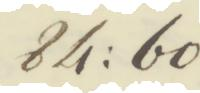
84:60
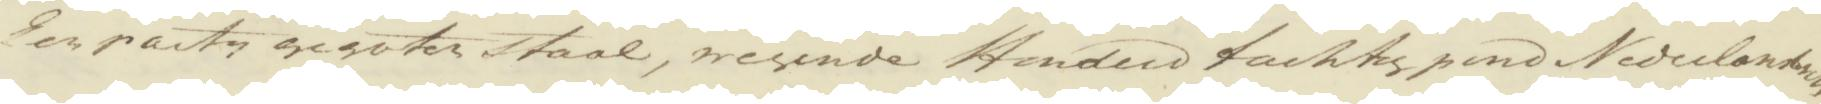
Een partij gegoten staal, wegende Honderd tachtig pond Nederlandsch
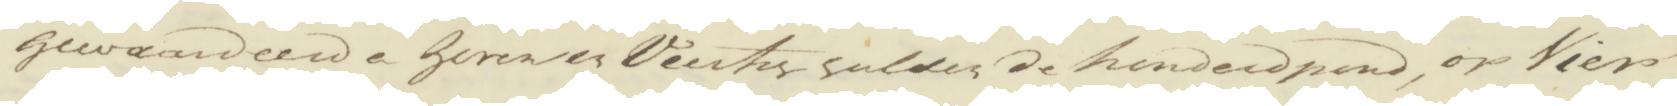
Gewaardeerd a Zeven en Veertig gulden de honderdpond, op Vier
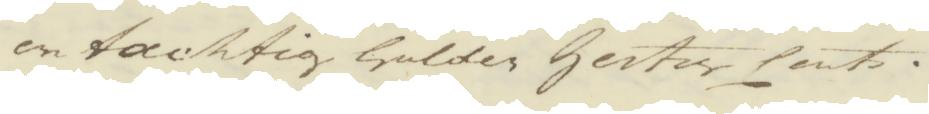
en tachtig Gulden zestig Cents
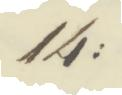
14:
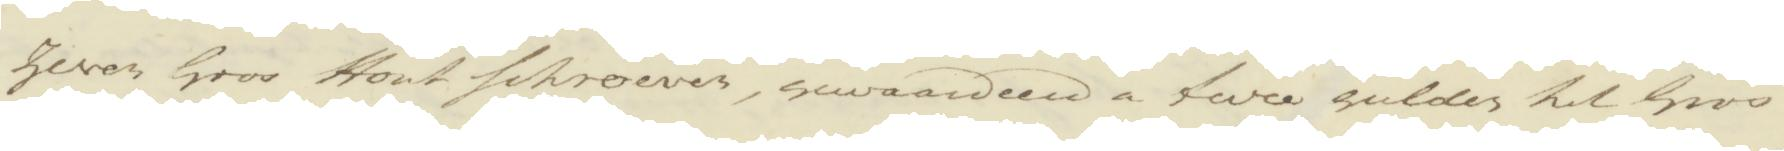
Zeven Gros Hout schroeven, gewaardeerd a twee gulden het Gros
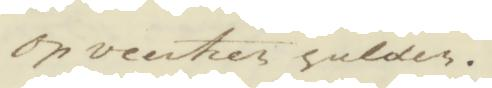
op veertien gulden.
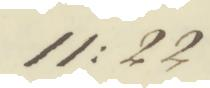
11:22
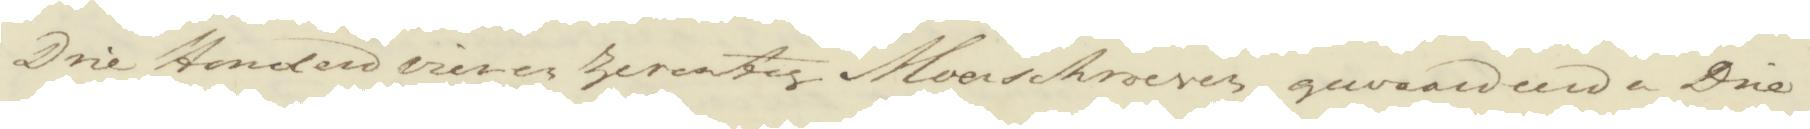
Drie Honderd vier en Zeventig Moerschroeven, gewaardeerd a Drie
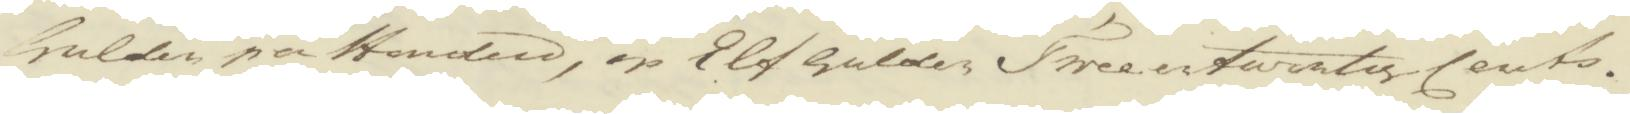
Gulden per Honderd, op Elf gulden Twee en twintig Cents.
